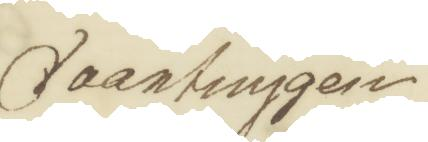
Vaartuygen
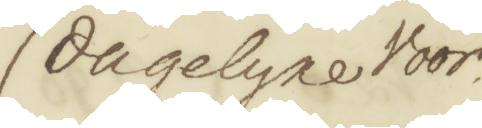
dagelyke Voor
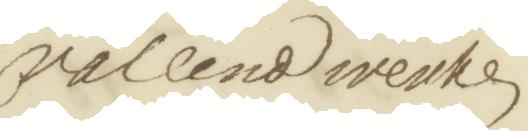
vallende werken
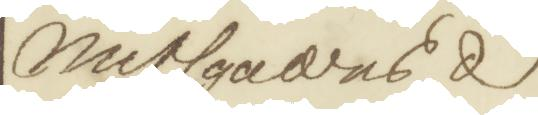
mitsgaders de
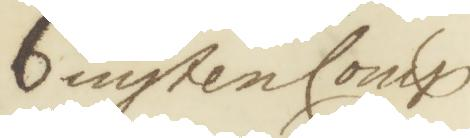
buyten Comp
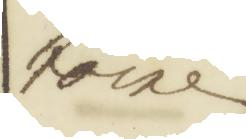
toiren.
